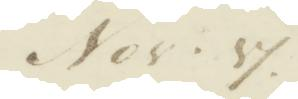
Nov. 17.
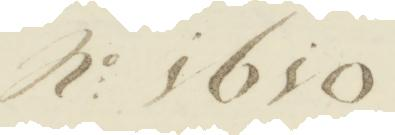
N:o 1610
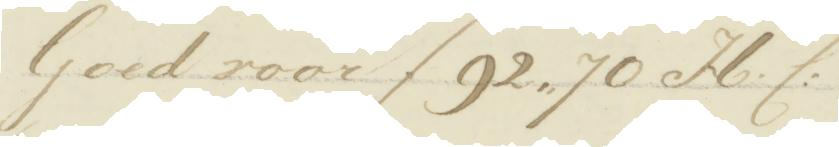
Goed voor ƒ 92„70 H: C:
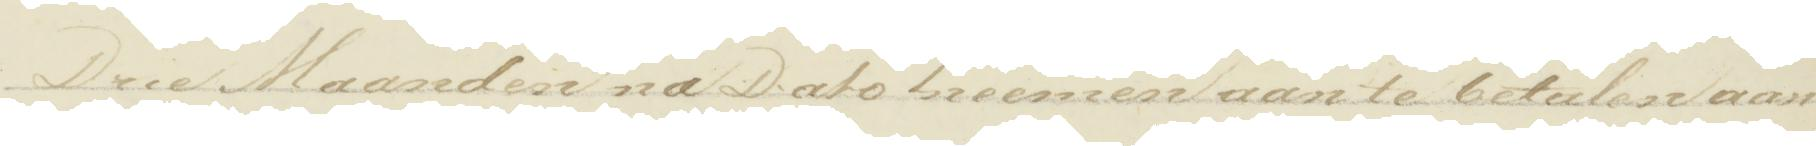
Drie Maanden na Dato neemen aan te betalen aan
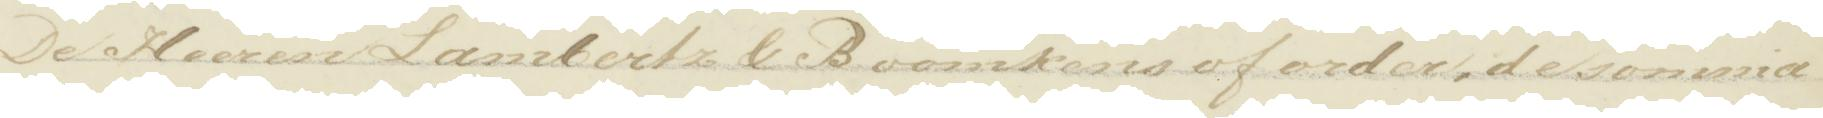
De Heeren Lambertz & Boomkens of order de somma
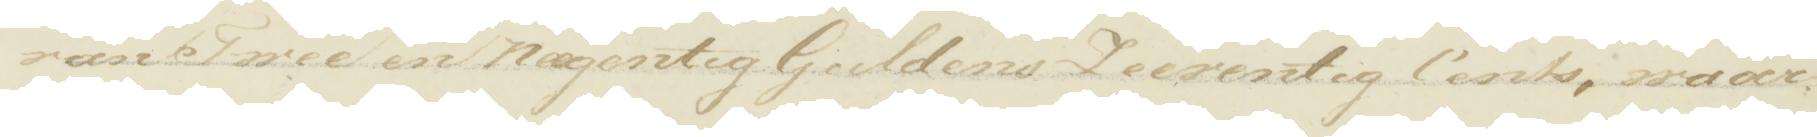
van Twee en Negentig Guldens Zeeventig Cents, waar
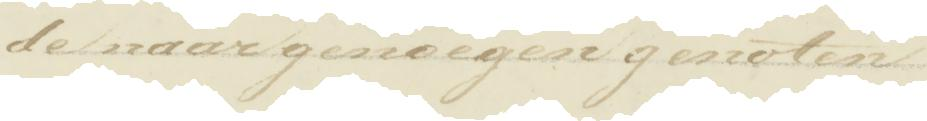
de naar genoegen genoten
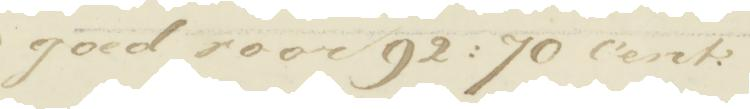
goed voor 92: 70 Cent:
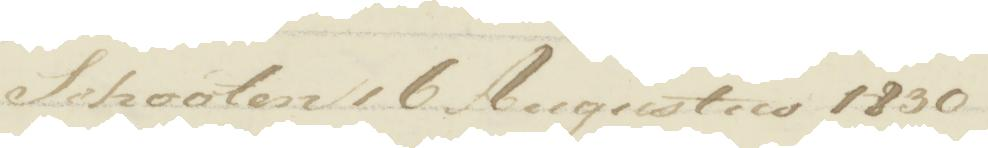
Schooten 16 Augustus 1830
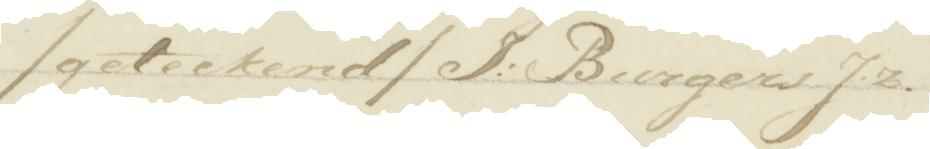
/geteekend/ J: Burgers J:z.
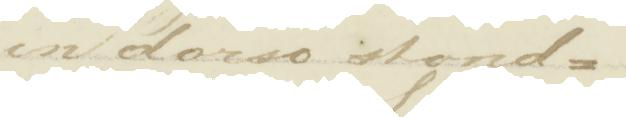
=in dorso stond =
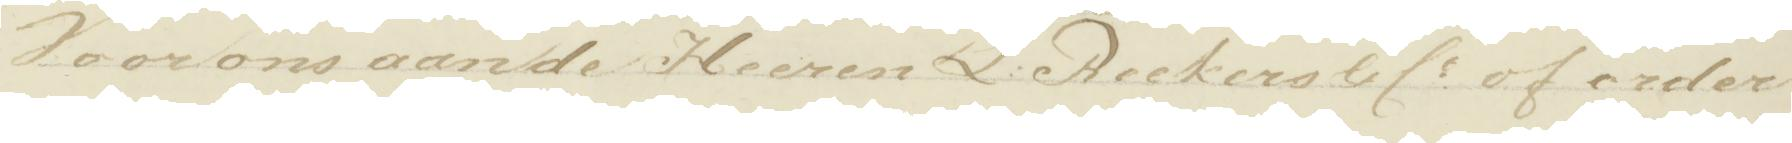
Voor ons aan de Heeren L. Reekers & C:s of order
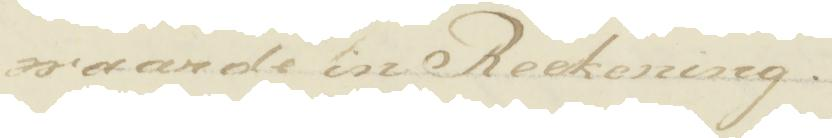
waarde in Reekening.
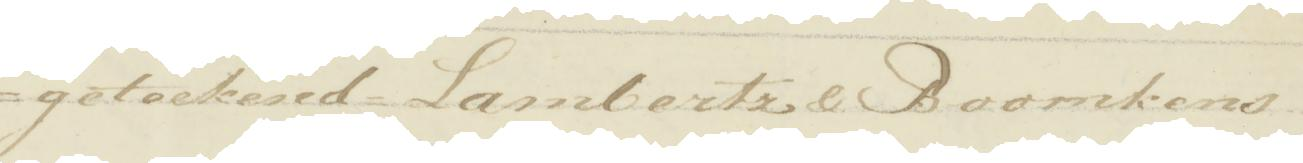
=geteekend Lambertz & Boomkens
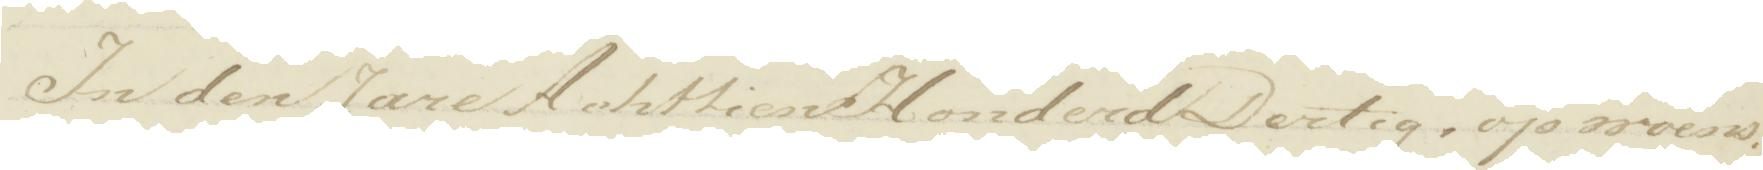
In den Jare Achttien Honderd Dertig, op woens,
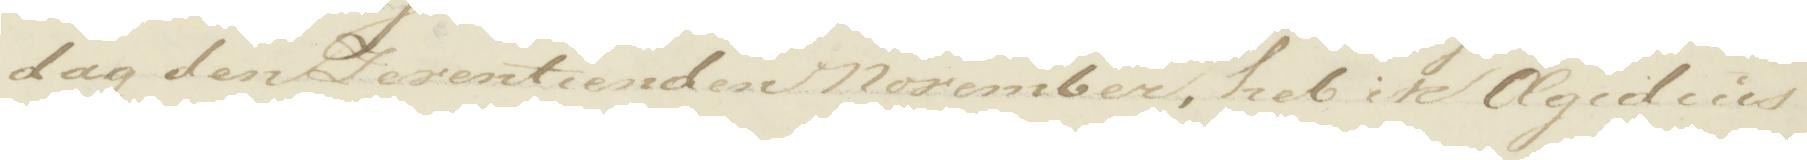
dag den Zeventienden November, heb ik Aegidius
